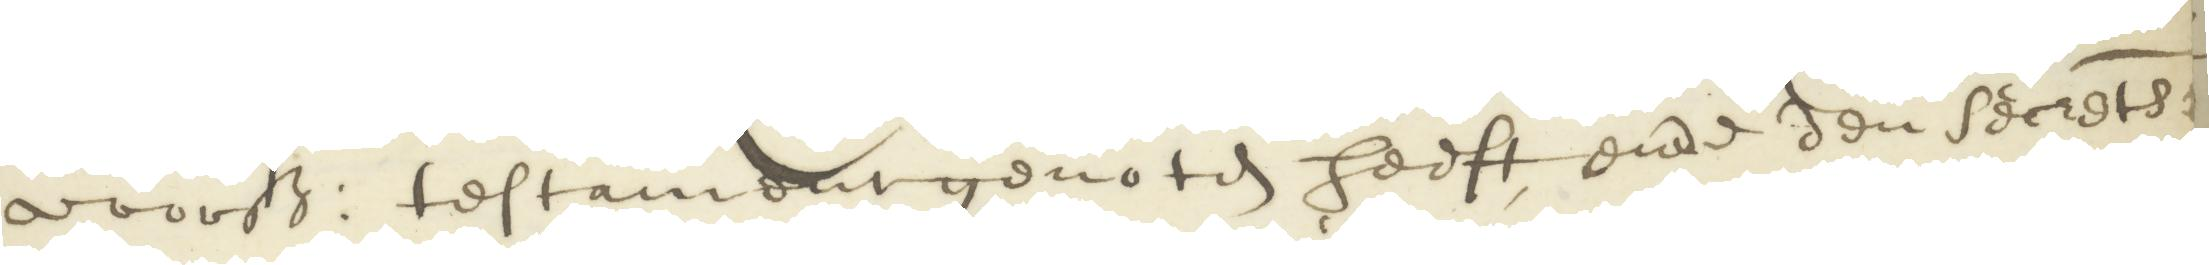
voorsz: testament genoten heeft ende den secrets
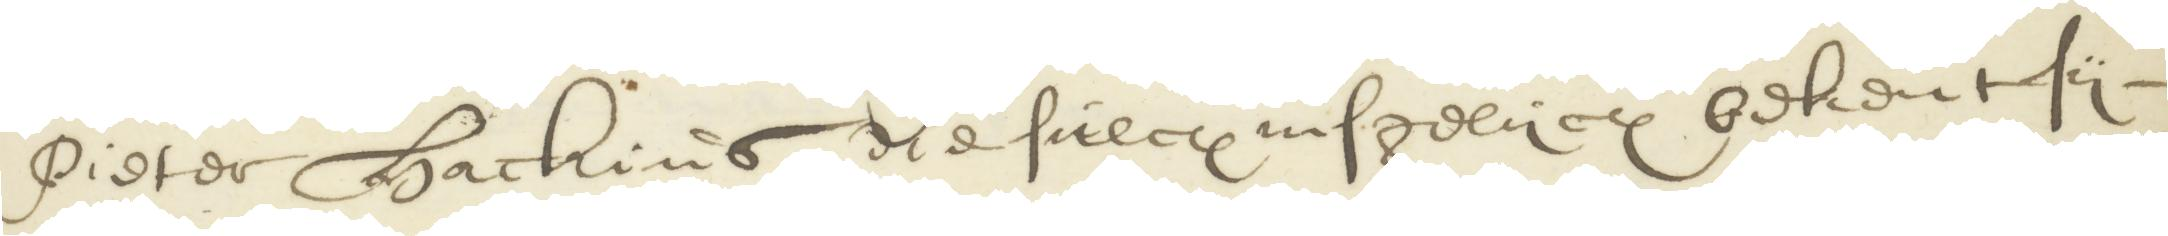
Pieter Hackius, die sulcx insgelijcx gekent sij
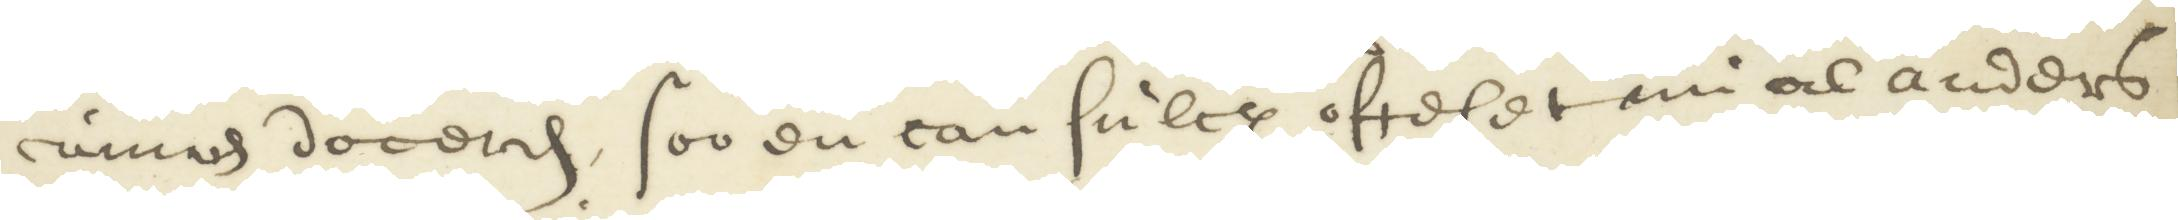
cunnen doceren, soo en can sulcx ofteset nu al anders
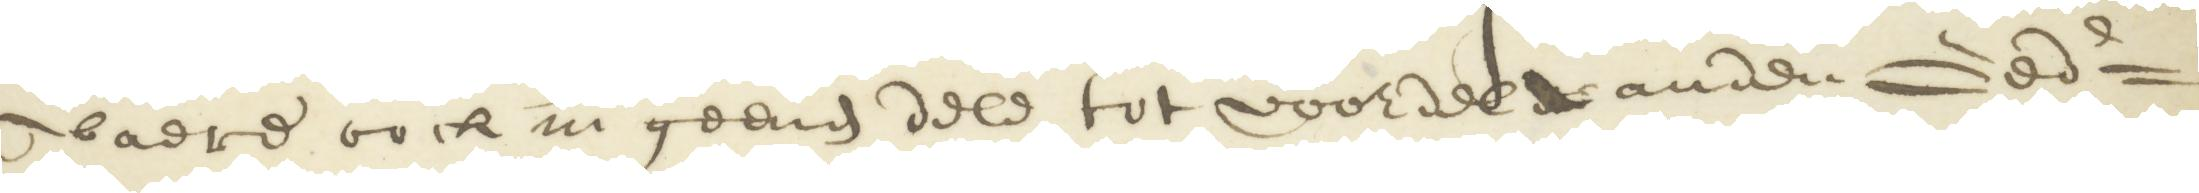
waere oock in geenen dele tot voordel vanden Ged=e
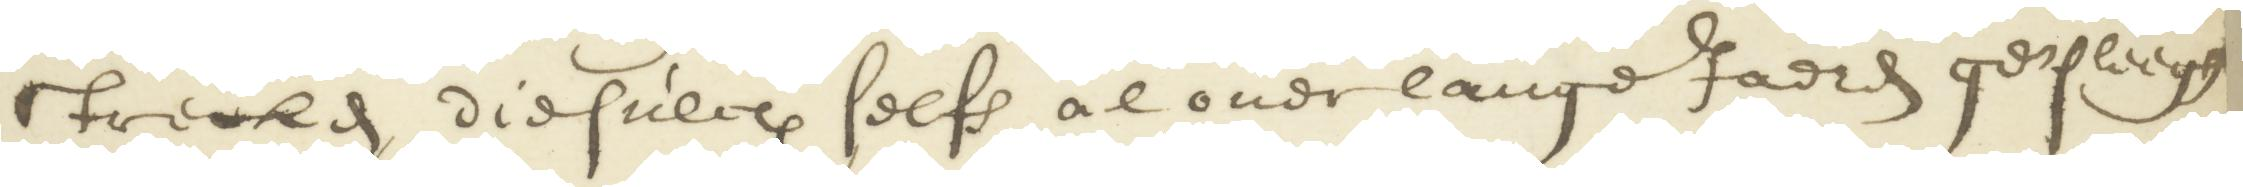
strecken, die sulcx selfs al over lange Jaeren gepleegt
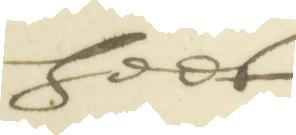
heef
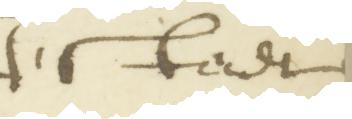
t' staet
